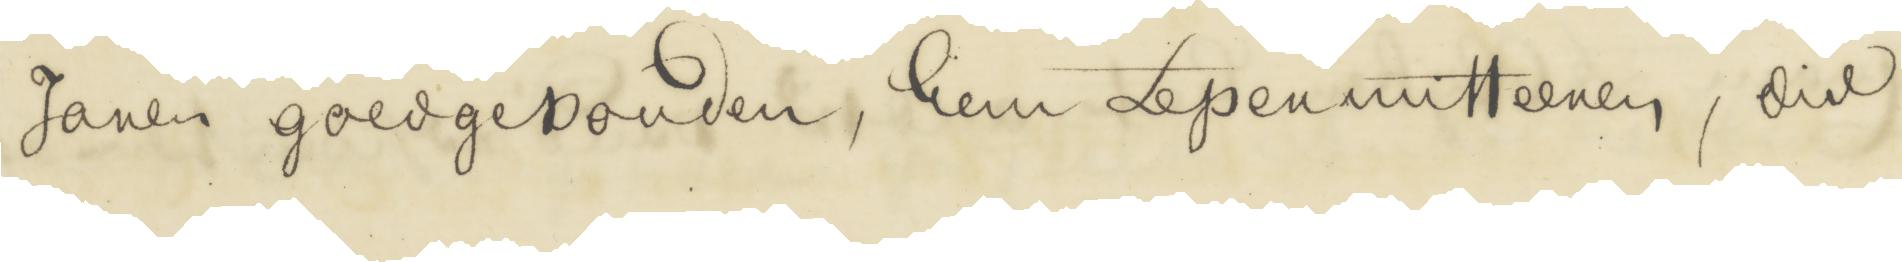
Jaren goedgevonden, hem tepermitteeren, die
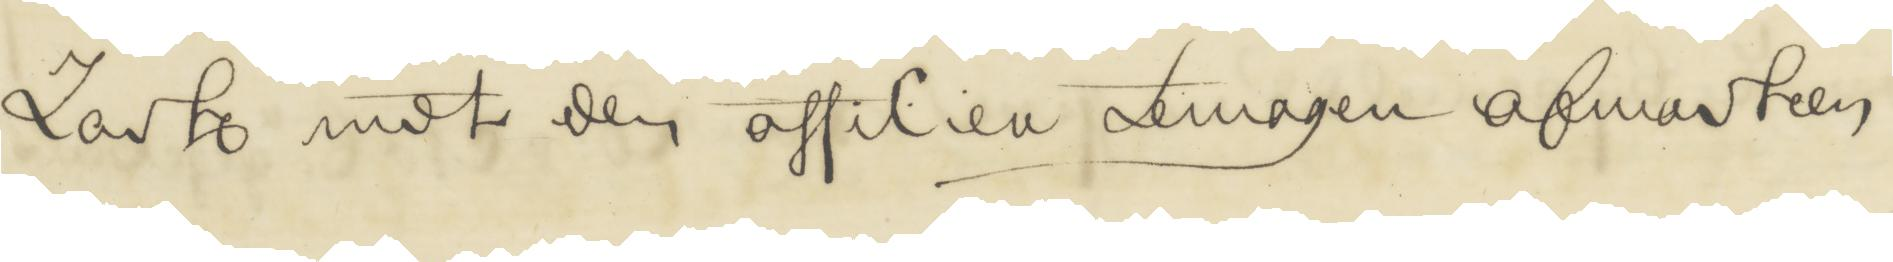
zaek met den officier temogen afmaeken
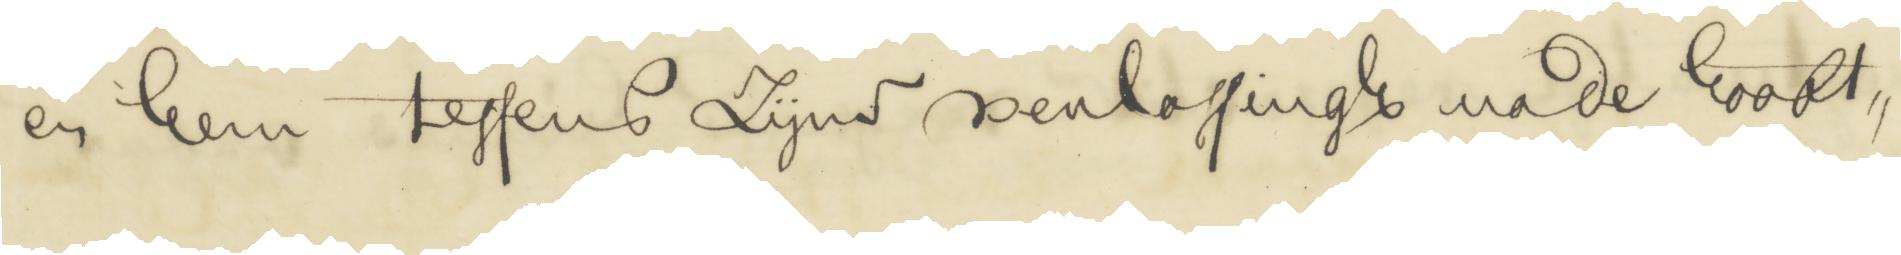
en hem teffens zijne verlossingh na de hooft„
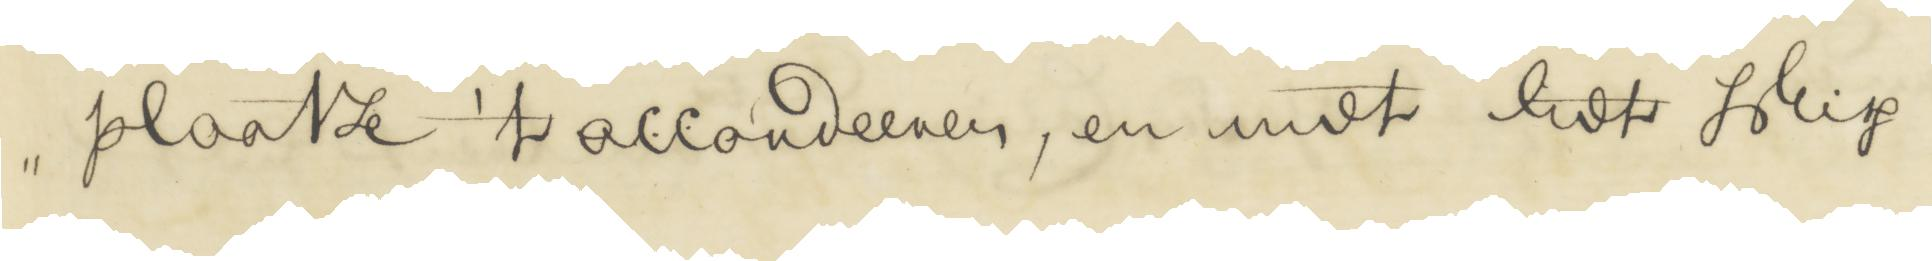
„ plaatze 't accordeeren, en met het schip
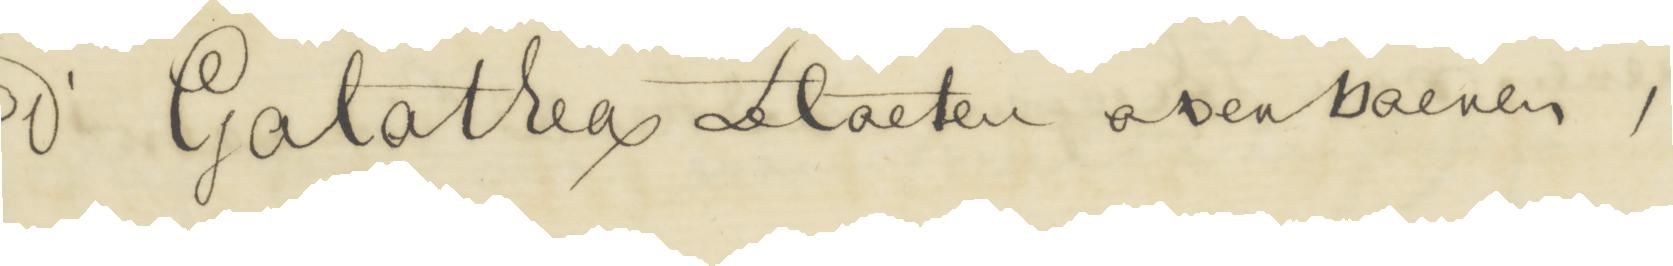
d’ Galathea telaeten overvaeren ;
